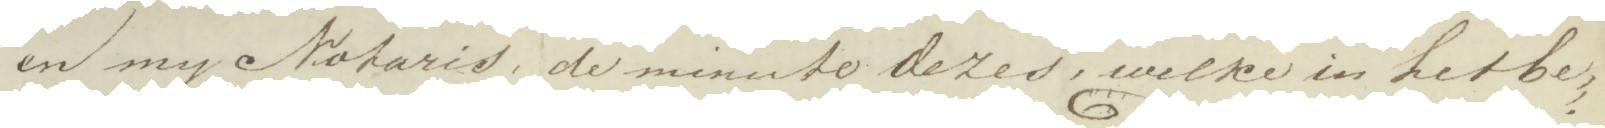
en my Notaris, de minute dezes, welke in het be„
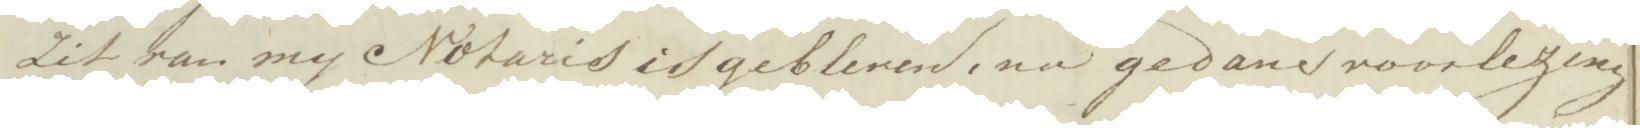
zit van my Notaris is gebleven, na gedane voorlezing
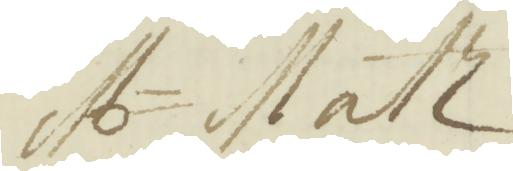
M= Math
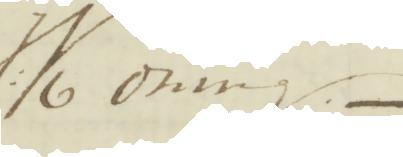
J:Koning. —
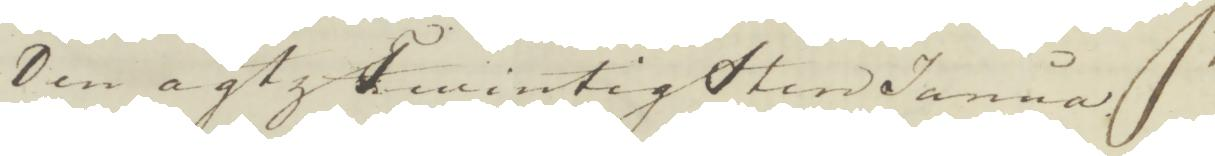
den agten Twintigsten Ianua
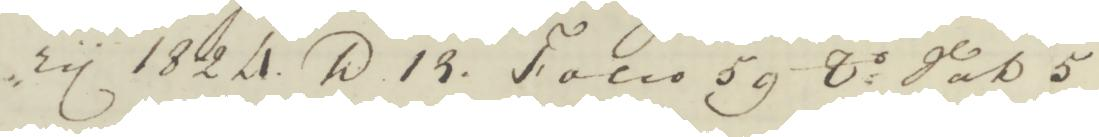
„rij 1824. D 13. Folio 59 r:o Vak 5
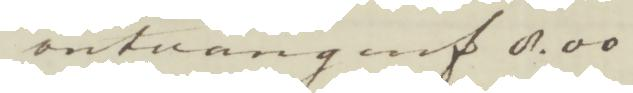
ontvangen ƒ 8.00
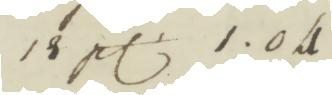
13 /c=t 1.04
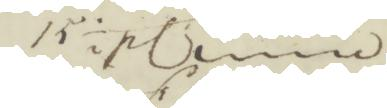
15½ /c=t —
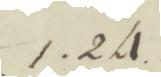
1.24.
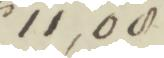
11,08
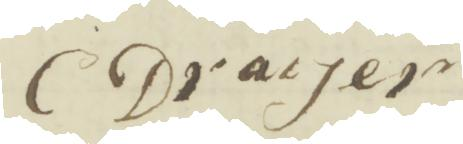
C Drayer
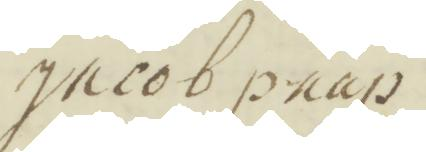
jacob paap
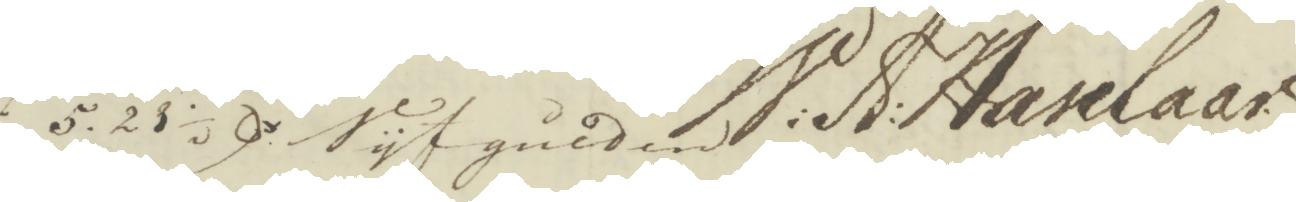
5:23½ p.r Vijf gulden W: A: Haselaar
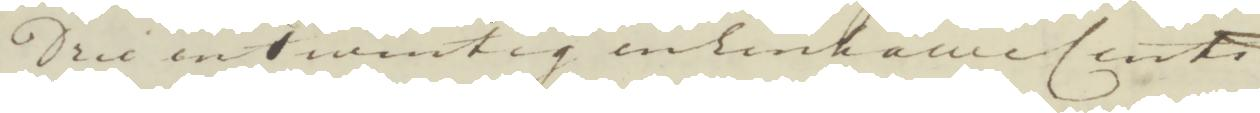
drie en twintig en Een halve Cents
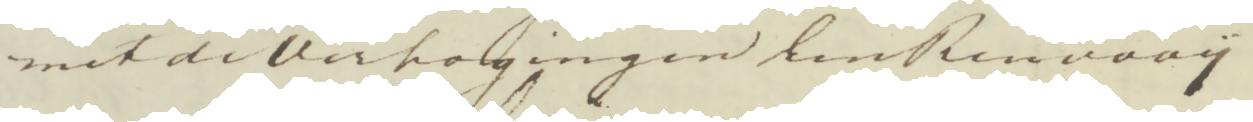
met de Verhogingen Een Renvooij
